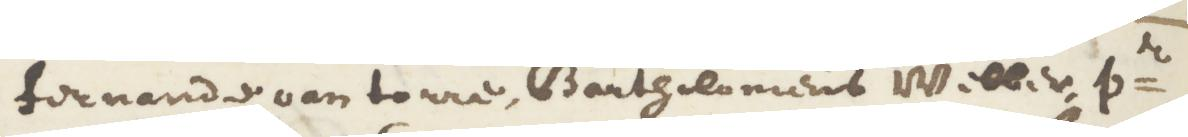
fernande van torre, Barthelomeus webber, p=r
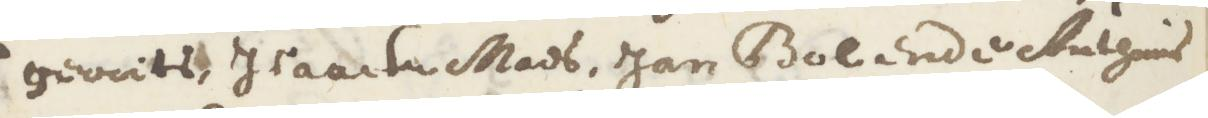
gerrits, Jsaack Maes, Jan Bol ende Anthonis
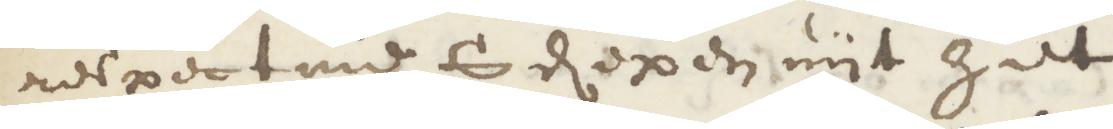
respective Schepen uijt het
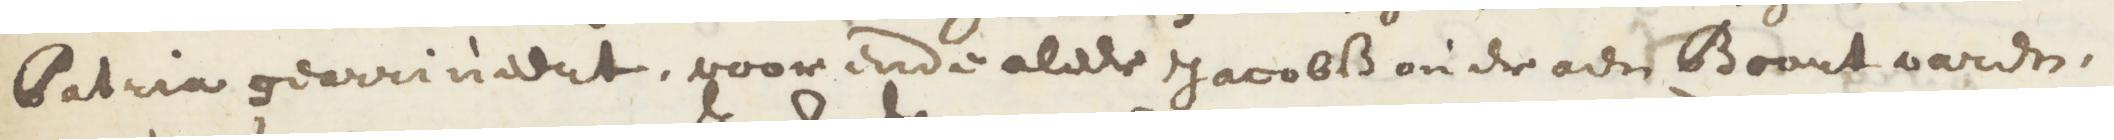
Patria gearriveert, voor ende aleer Jacobsz over aen Boort varen,
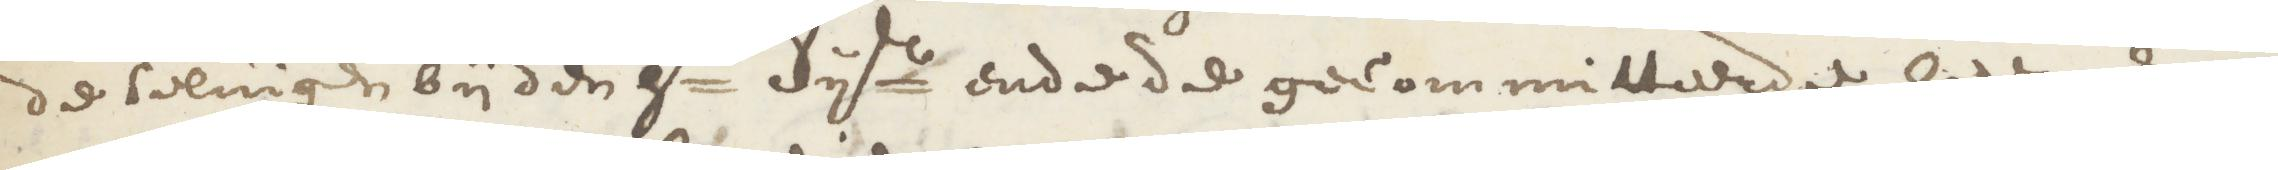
de selvigen bij den h=r Eij=r ende de gecommitteerde heeren —
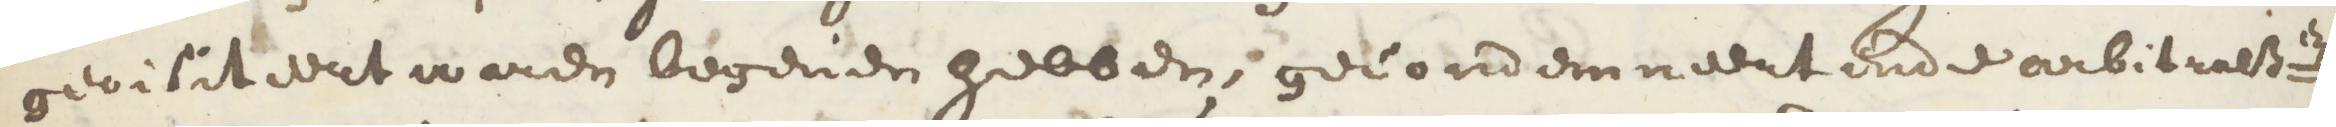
gevisiteert waren begeven hebben, gecondemneert ende arbitralijk=en
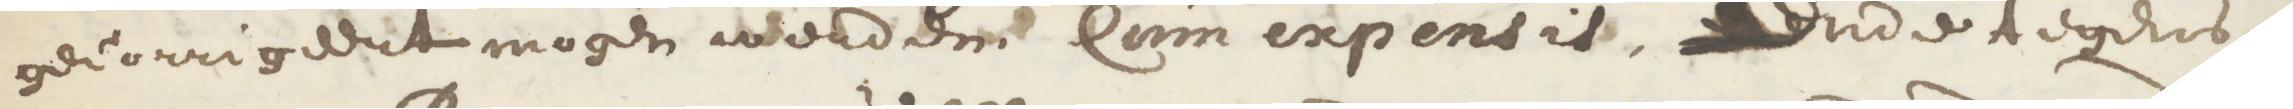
gecorrigeert mogen werden Cum expensis, Ende tegens —
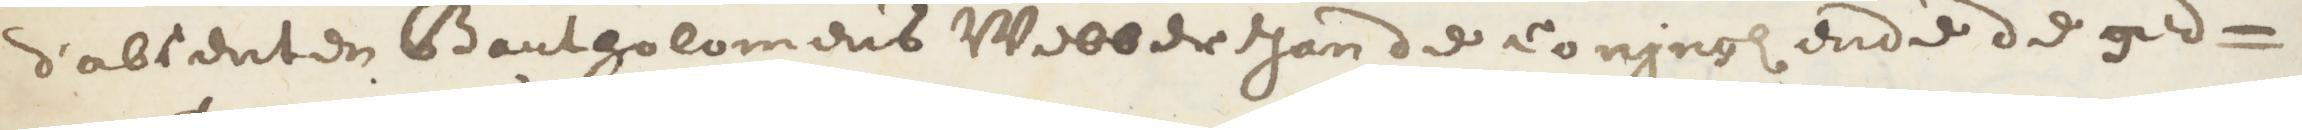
d’ absenten Bartholomeus Webber Jan de Conjngh ende de ged=e
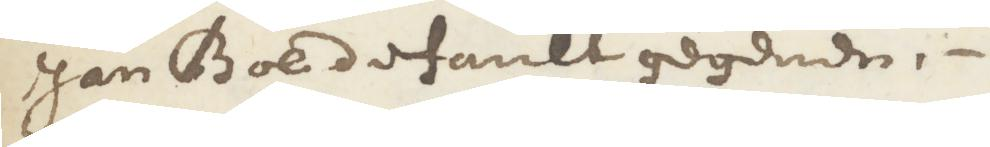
Jan Bol default gegeven. —
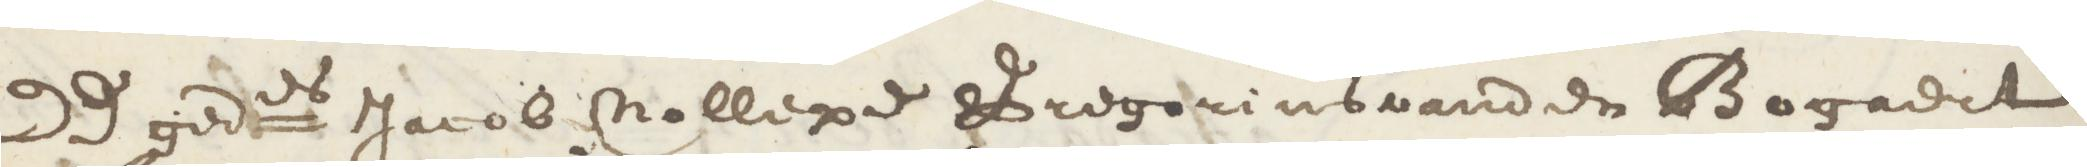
DE ged=es Jacob Nollepe Gregorius vanden Bogaert
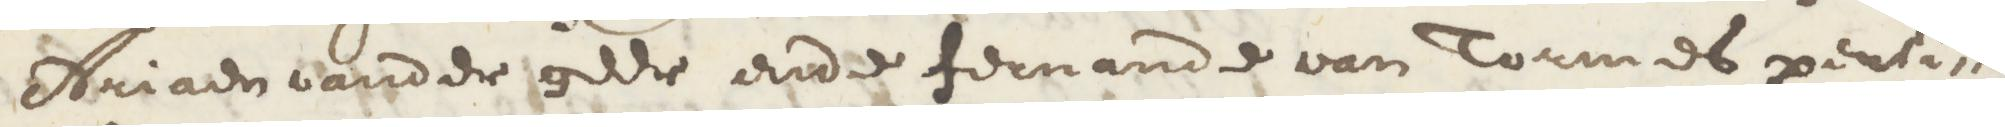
Ariaen vander geer ende fernande van Tormes persi„
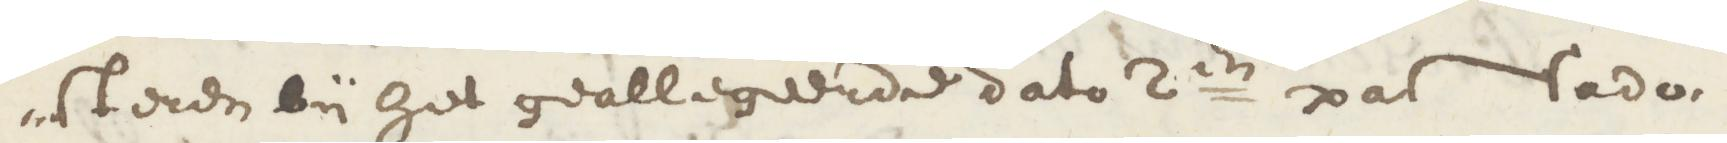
„steren bij het geallegeerde dato 2=en passado.
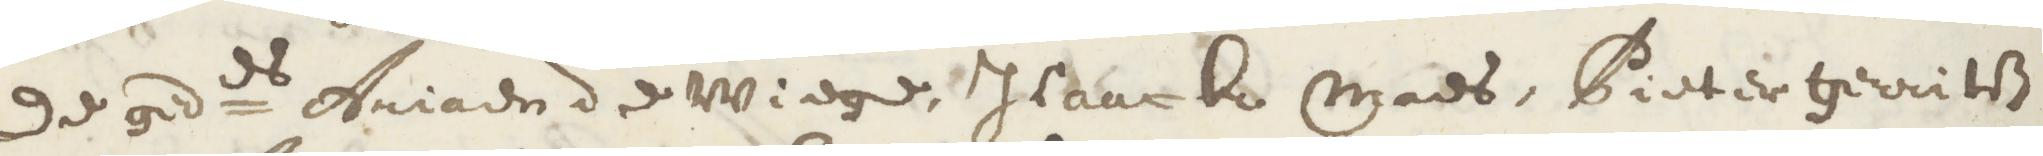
De ged=es Ariaen de Wiege, Jsaack maes, Pieter gerrits
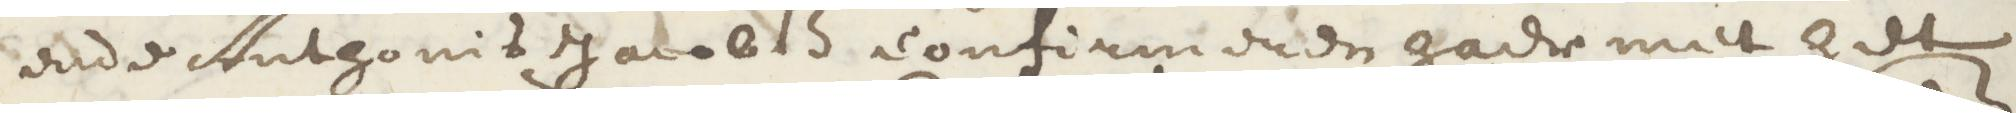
ende Anthonis Jacobs confirmeren haer met het
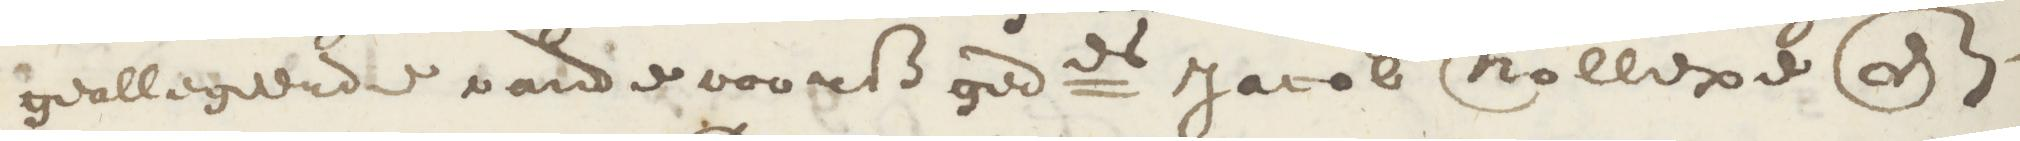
geallegeerde vande voors ged=es Jacob Nollepe ende —
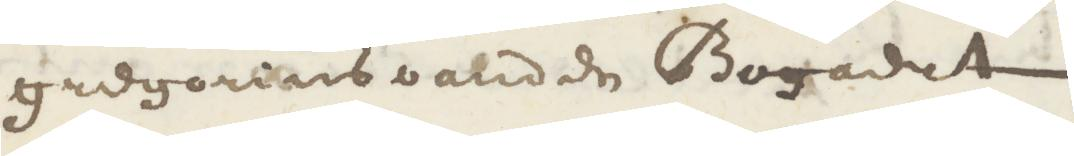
gregorius vanden Bogaert
